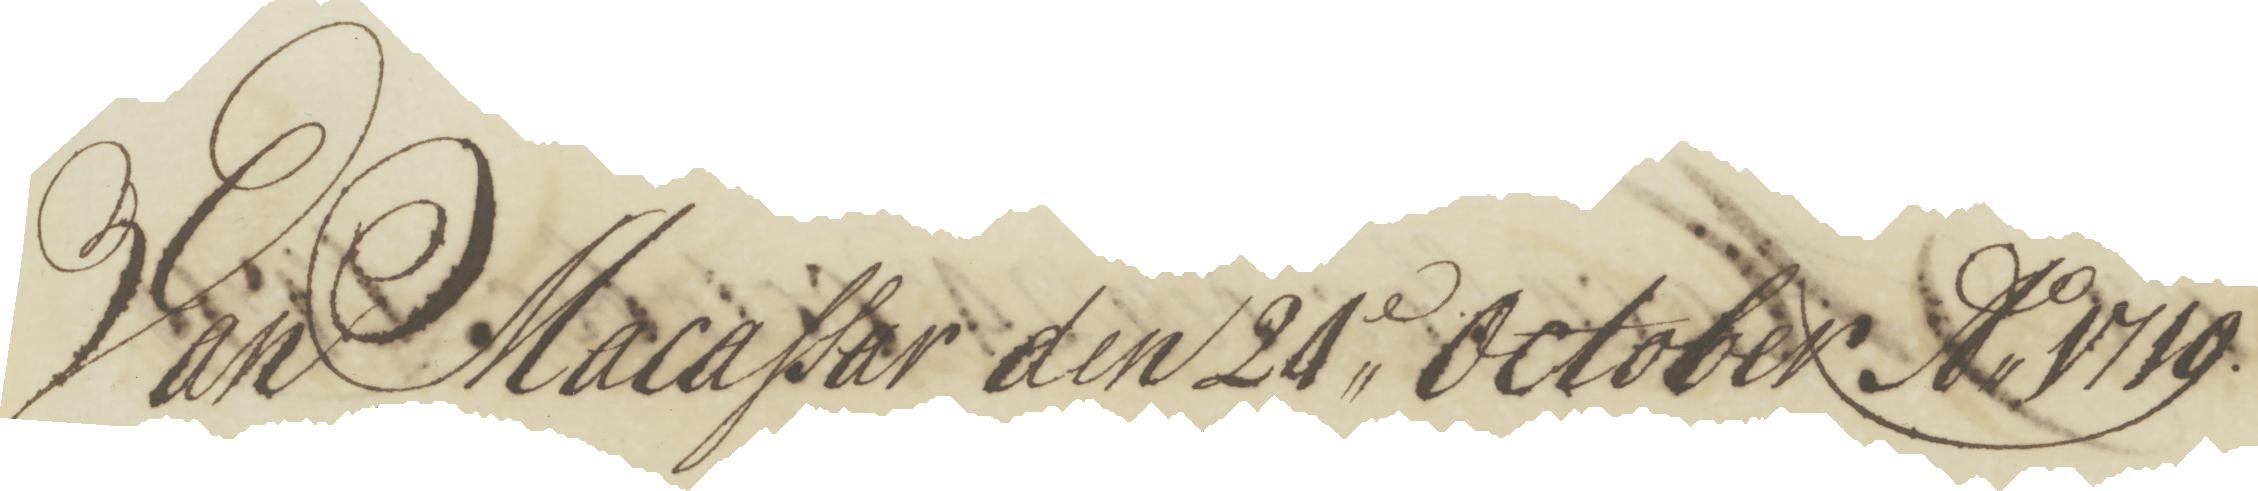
Van Macassar den 24„e October A„o 1719.
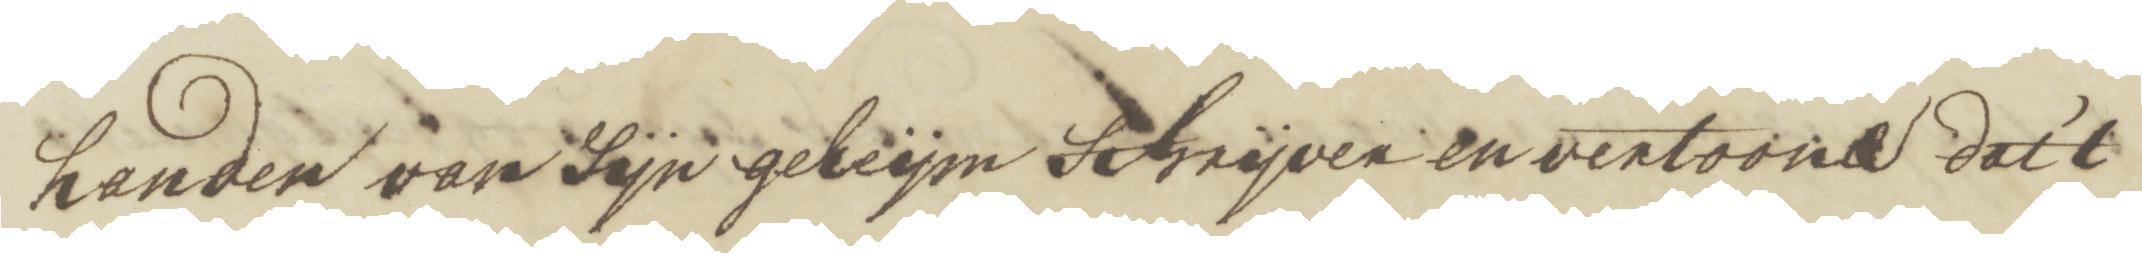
handen van sijn geheijm schrijver en vertoond dat ’t
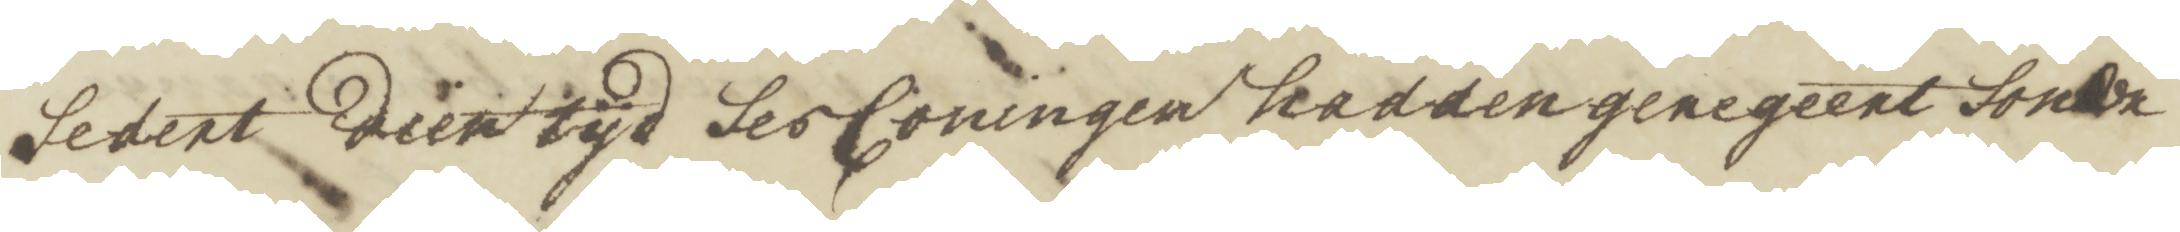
sedert dien tijd ses Coningen hadden geregeert sonder
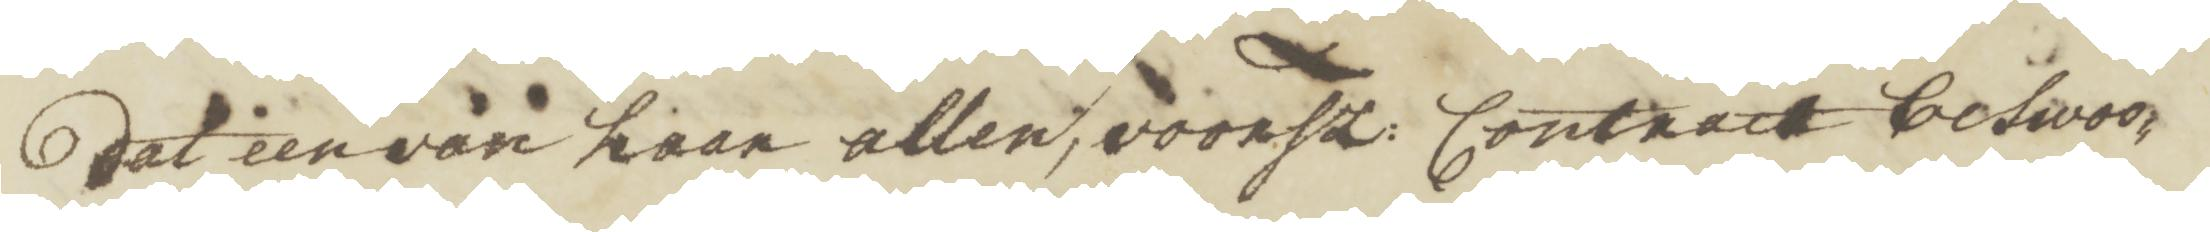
dat een van haar allen, voorsz: Contract beswoo„
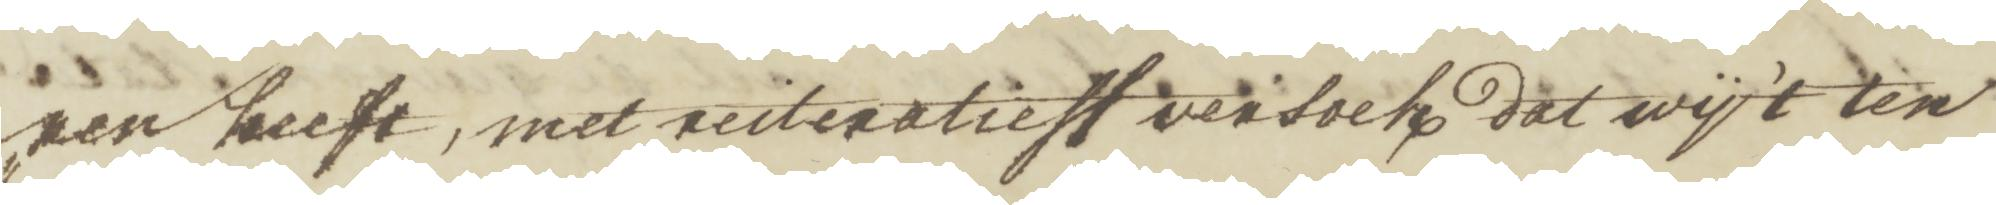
ren heeft, met reiteratieff versoek dat wij ’t ten
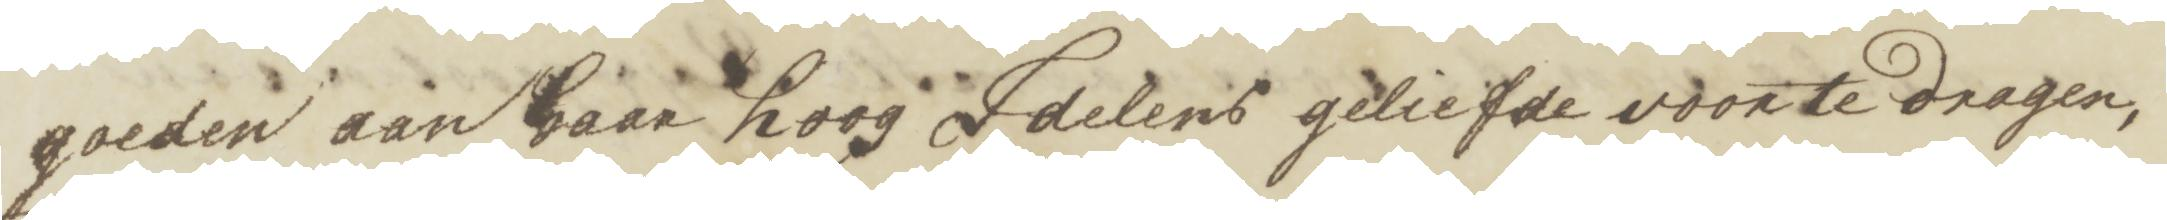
goeden aan haar hoog Edelens geliefde voor te dragen,
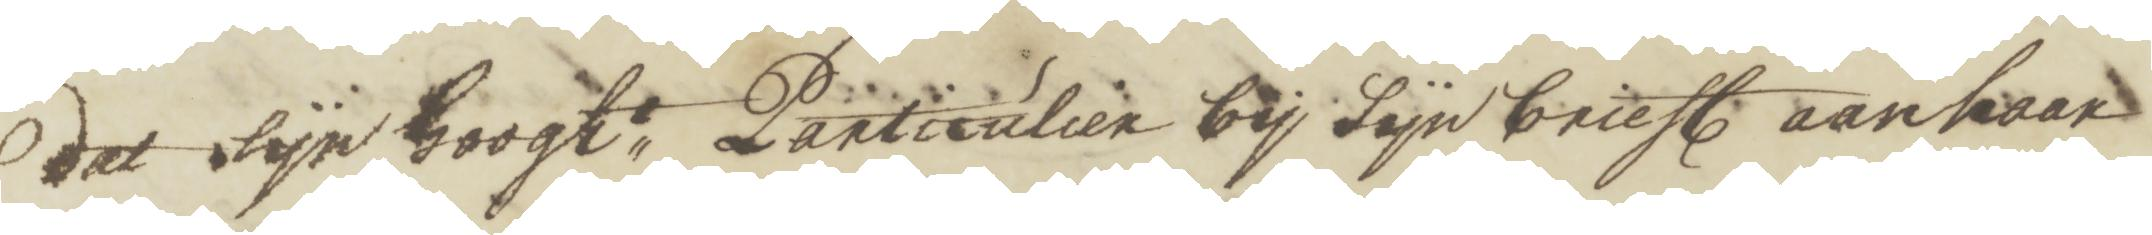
dat sijn hoogh„t Particulier bij sijn brieff aan haar
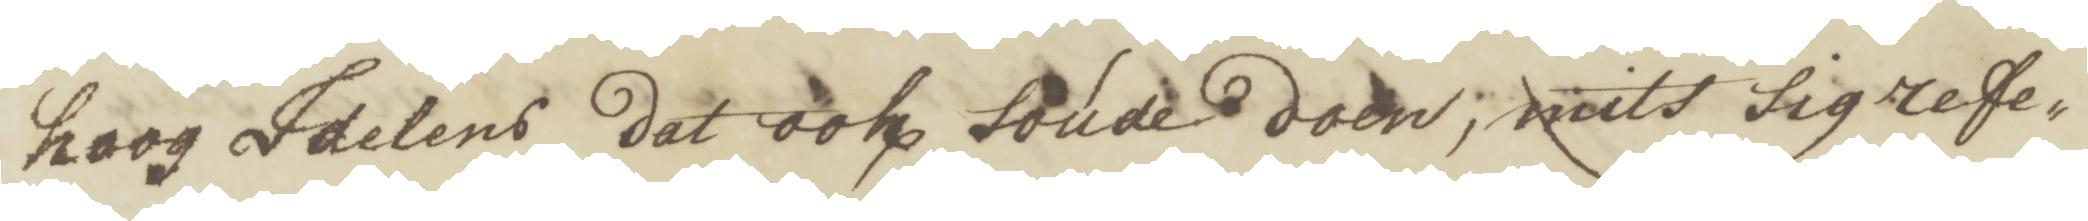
hoog Edelens dat ook soude doen; mits sig refe„
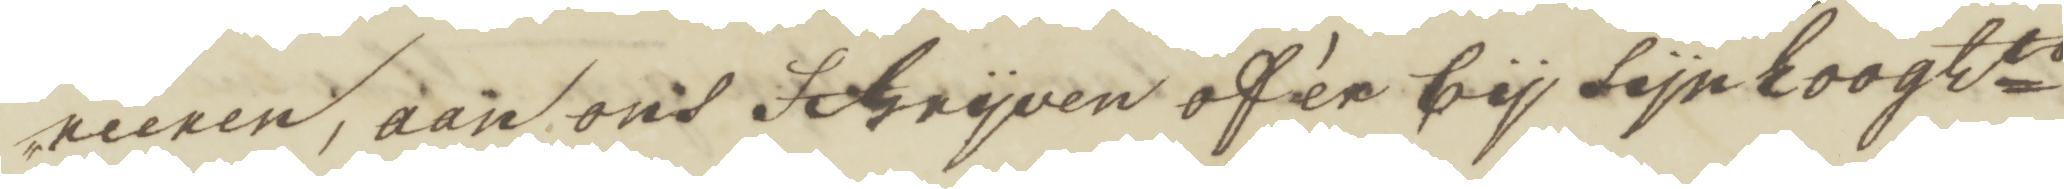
„reeren, aan ons schrijven of 'er bij sijn hoogh=ts
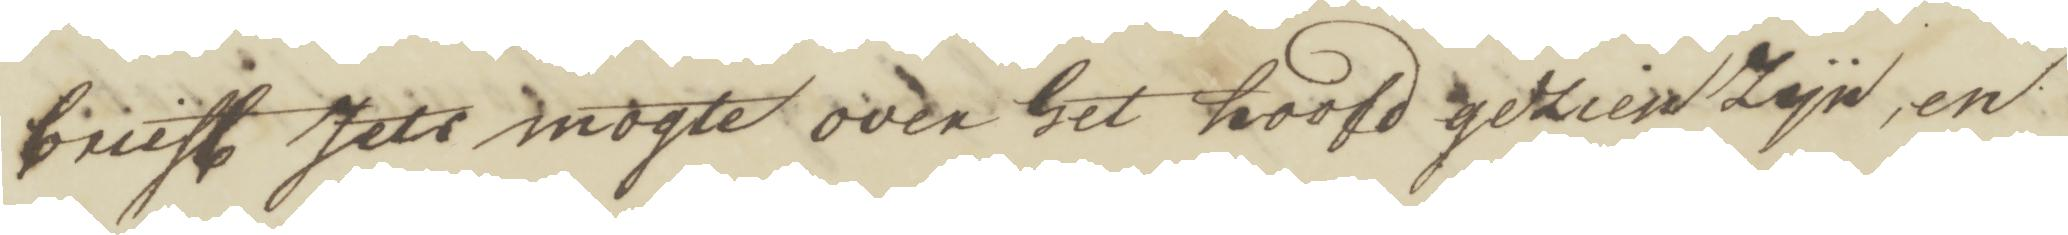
brieff Jets mogte over het hoofd gezien zijn, en
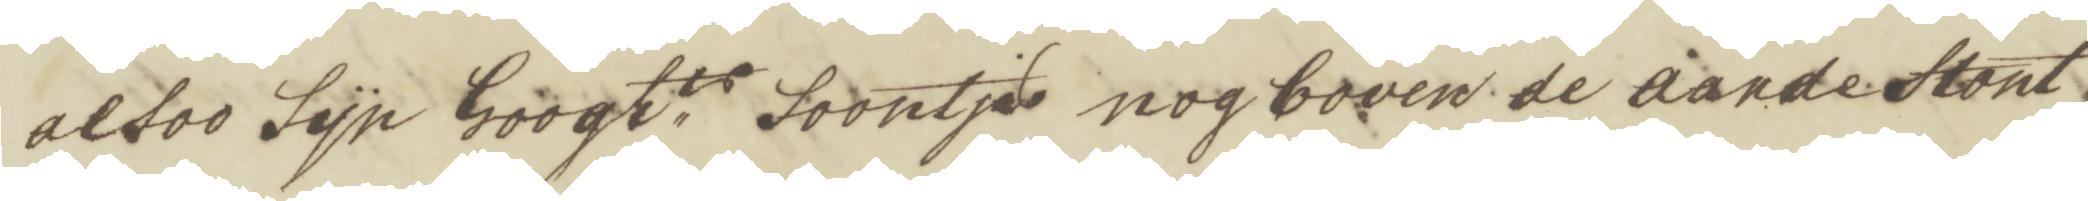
alsoo sijn hoogh„ts soontje nog boven de aarde stont
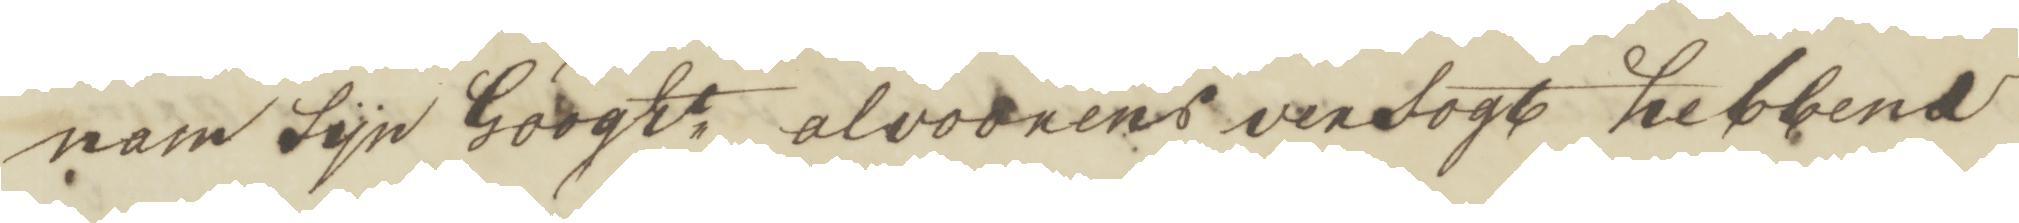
nam sijn hoogh„t alvoorens versogt hebbende
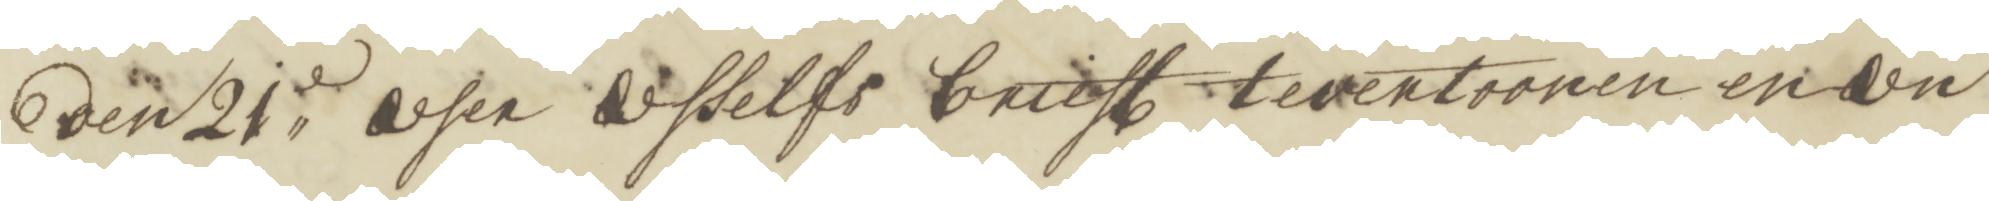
den 21„e deser desselfs brieff tevertoonen en den
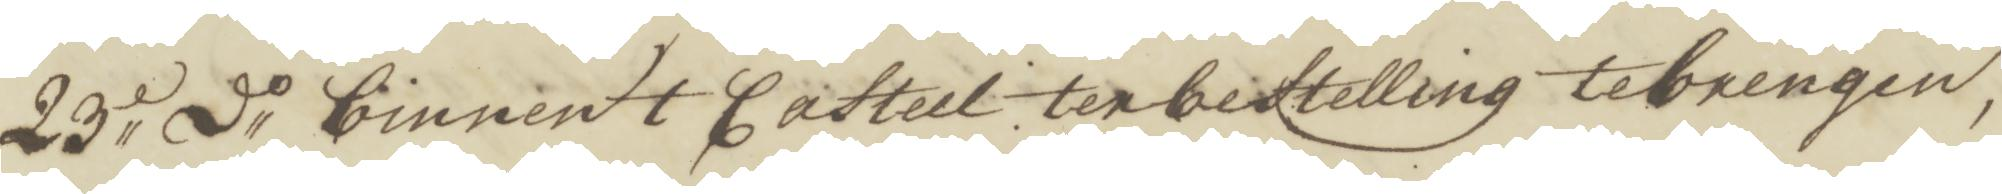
23„e d„o binnen ’t Casteel ter bestelling te brengen,
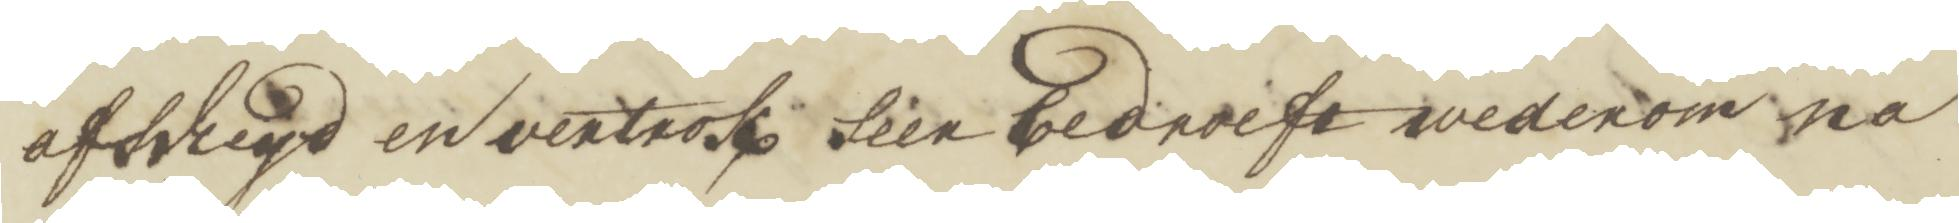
afscheijd en vertrok seer bedroeft wederom na
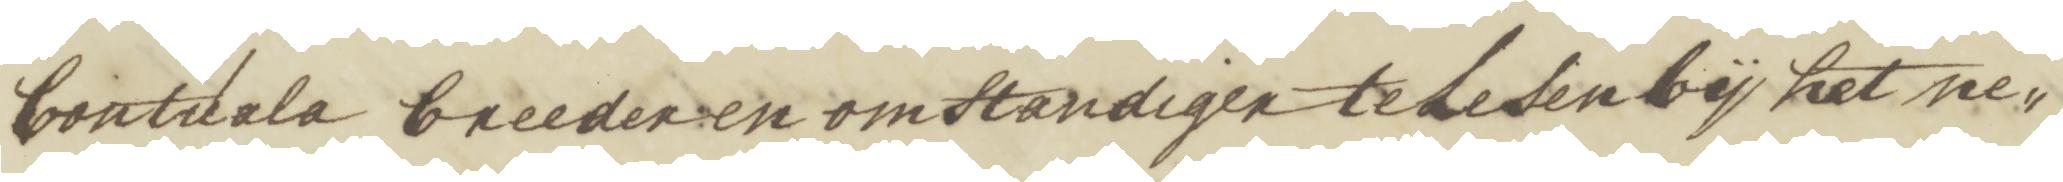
bontuala breeder en omstandiger te lesen bij het ne„
